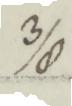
3/8
